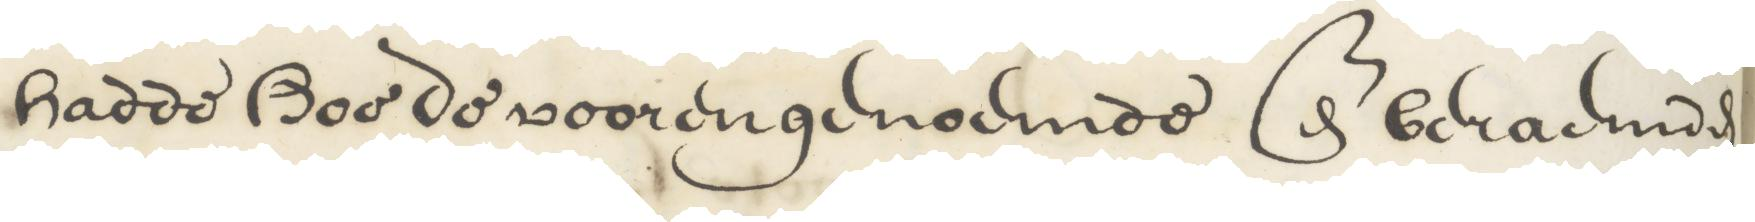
hadde hoe de voorengenoemde ende beraemden
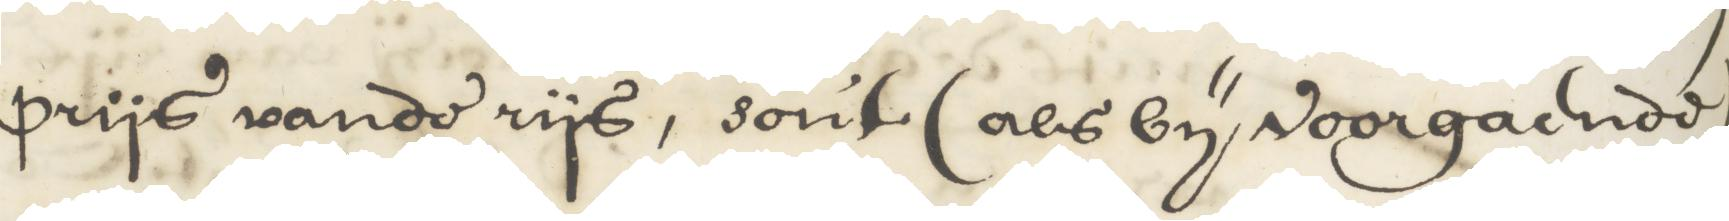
prijs vande rijs, sout (als bij voorgaende)
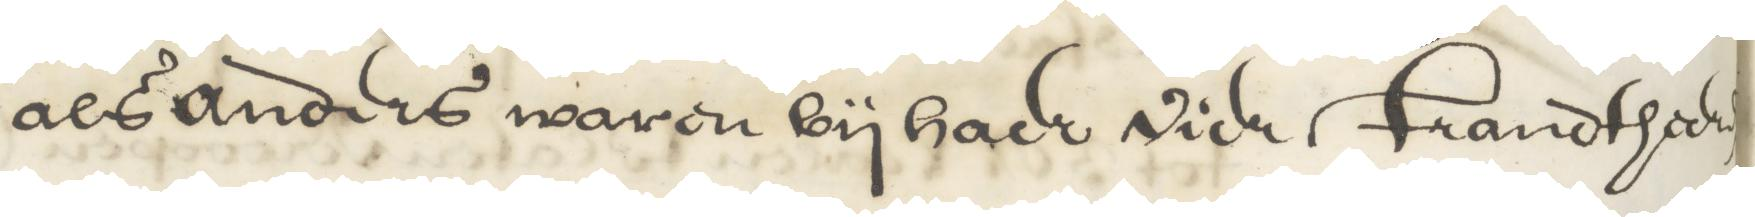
als anders waren bij haer vier strandtheeren
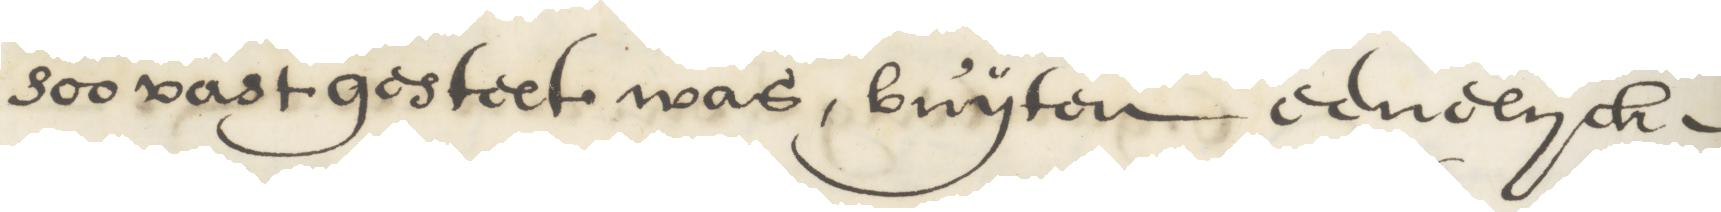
soo vast gestelt was, buijten eenelijck
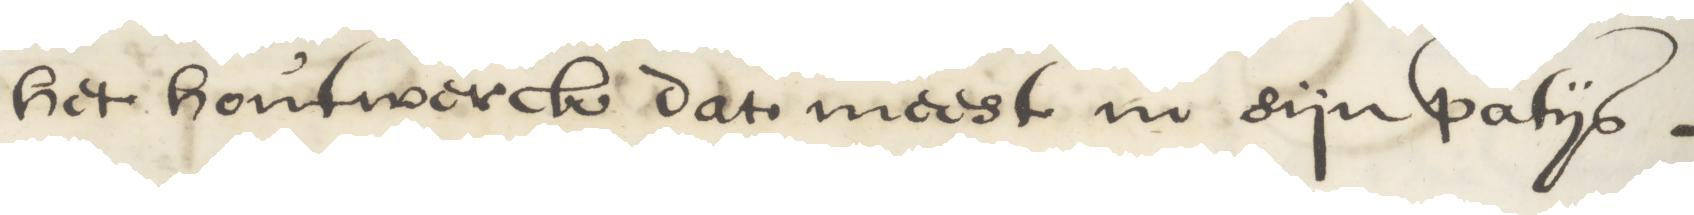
het houtwerck dat meest in sijn palijs
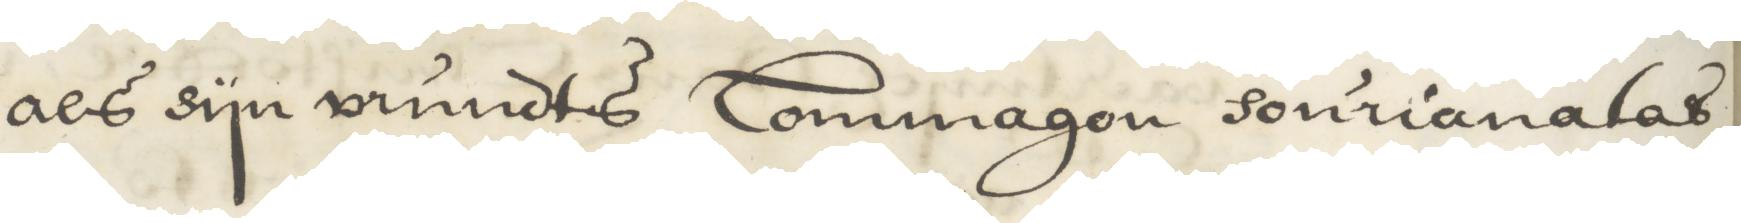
als sijn vrundts Commagon sourianalas
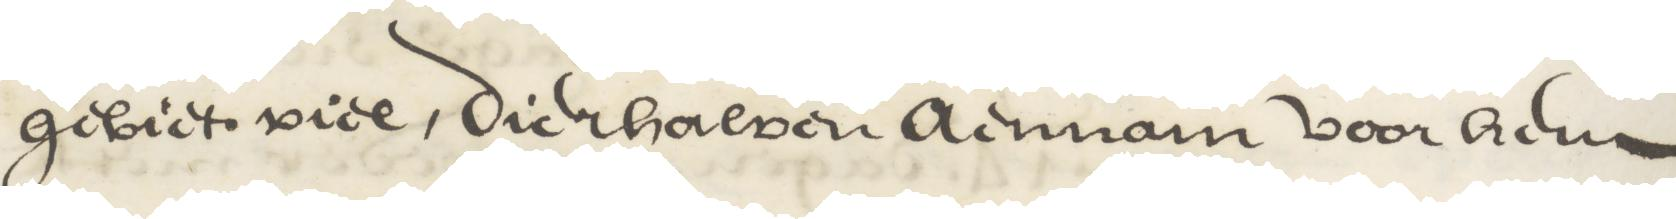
gebiet viel, dierhalven Aennam voor hem
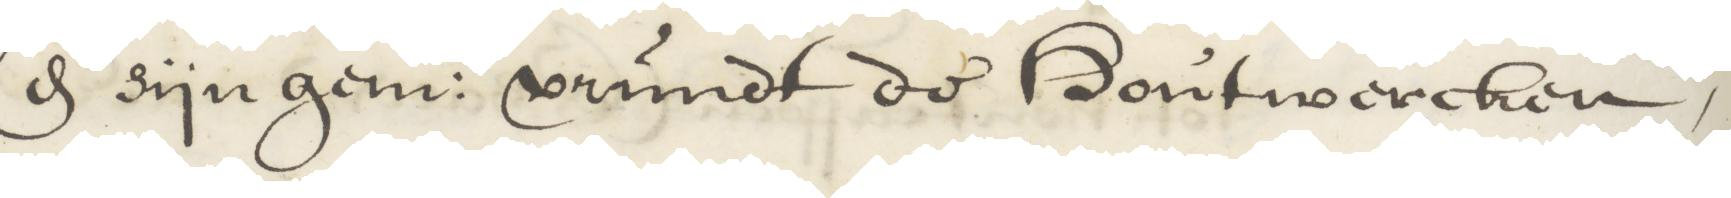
ende sijn gem:te vrundt de Houtwercken,
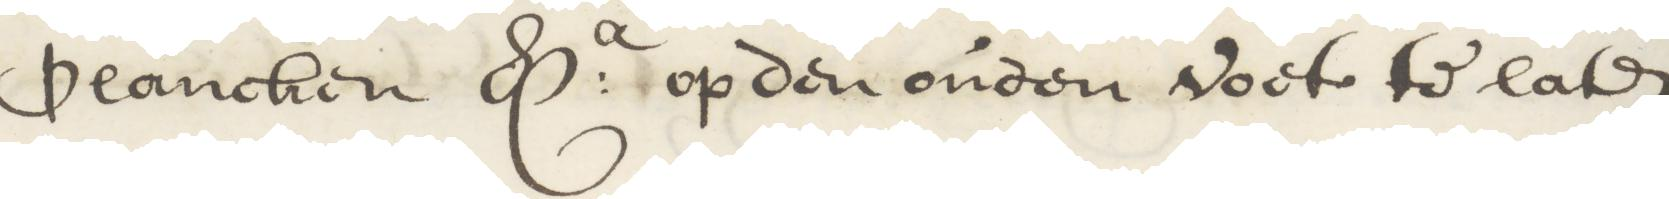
plancken &C:a op den ouden voet te laten
